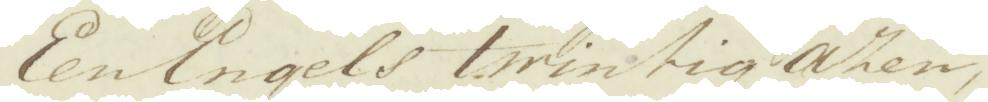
Een Engels twintig azen,
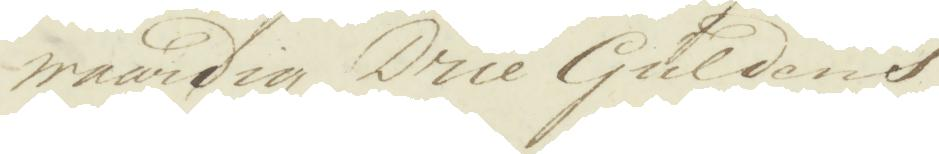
waardig Drie Guldens
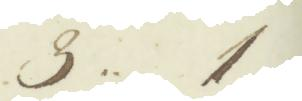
3 „ 1
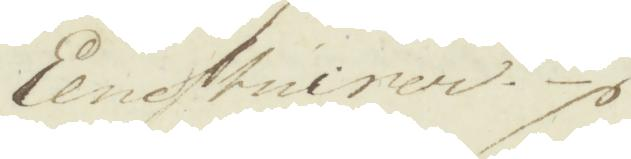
Een stuiver. —
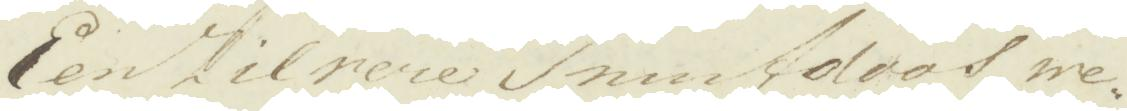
Een Zilvere Snuifdoos, we„
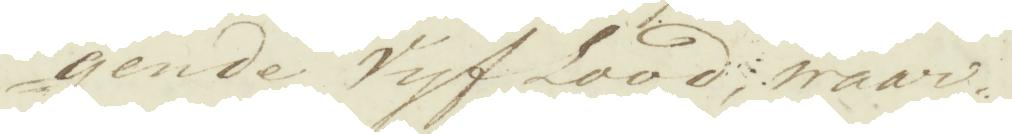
„gende Vyf Lood, waar„
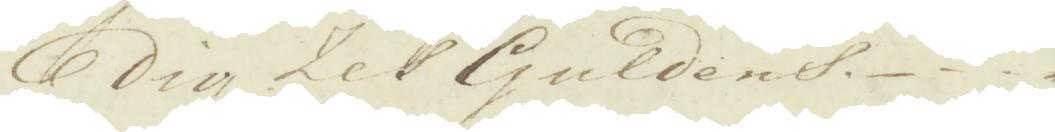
dig Zes Guldens. —
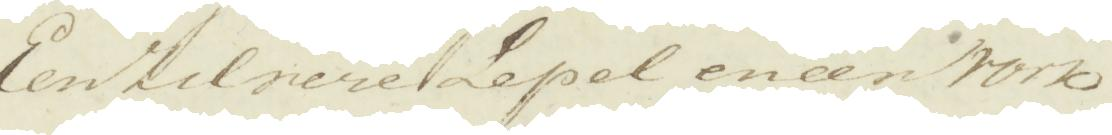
Een Zilvere Lepel en een vork
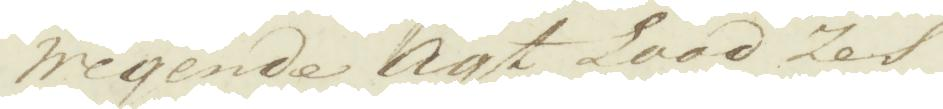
wegende Agt Lood Zes
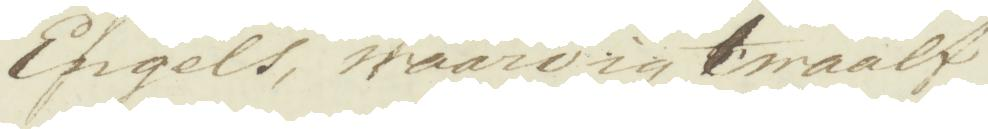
Engels, waardig twaalf
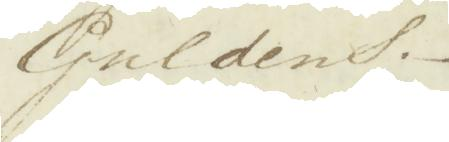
Guldens. -
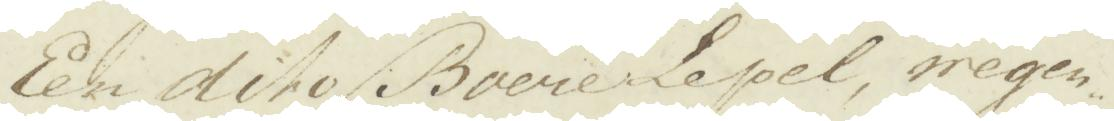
Een dito Boere Lepel, wegen„
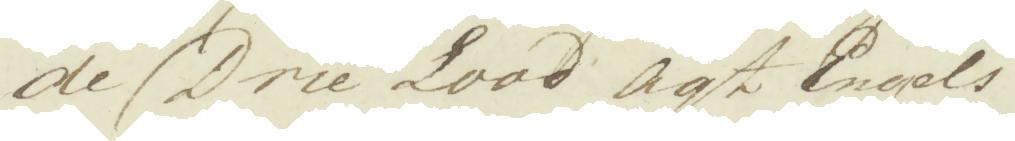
de Drie Lood agt Engels
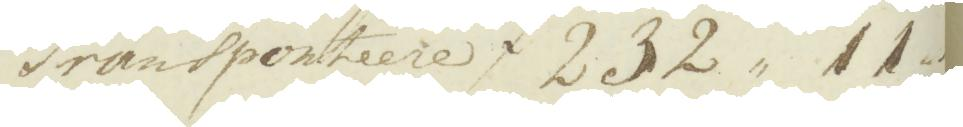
Transporteere ƒ 232 „ 11 „
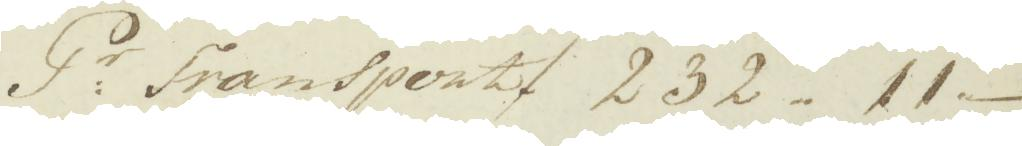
P:r Transport ƒ 232 „ 11 „—-
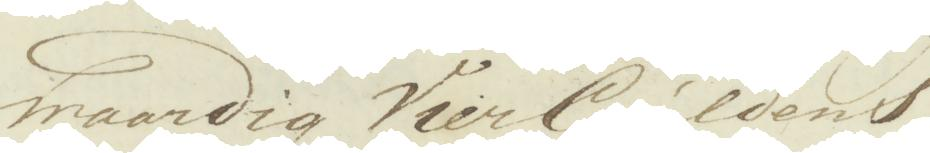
waardig Vier Guldens
